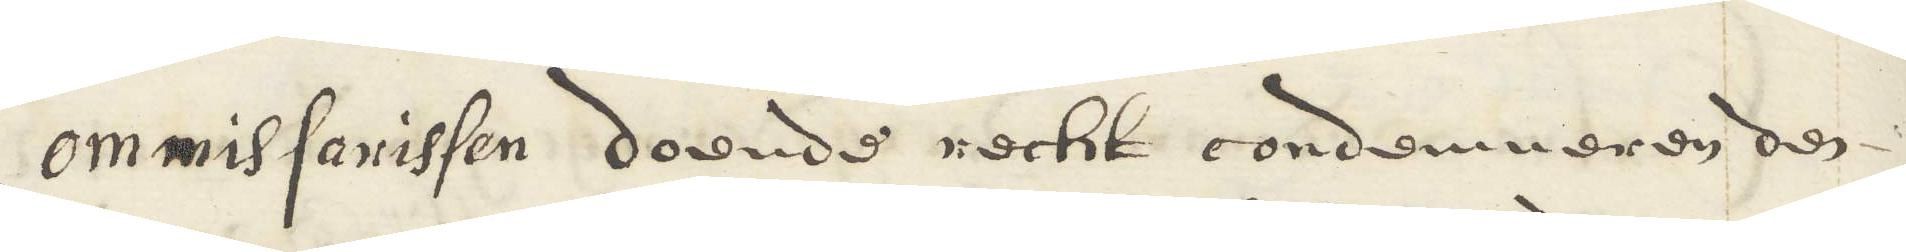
Commissarissen doende recht condemneren den
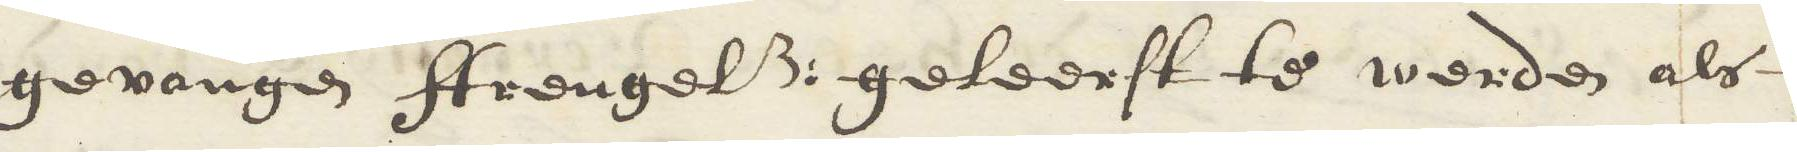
gevangen strengelijk geleerst te werden als-
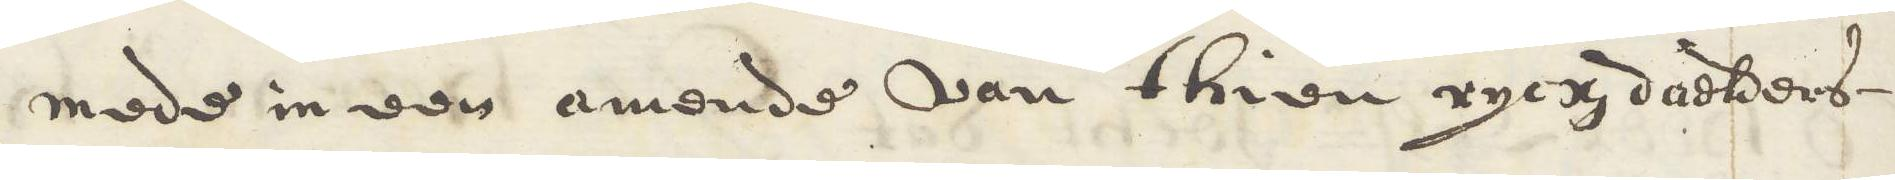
mede in een amende van thien rijcxdaelders-
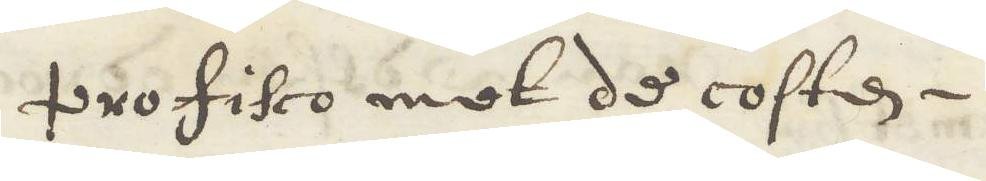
pro fisco met de costen —
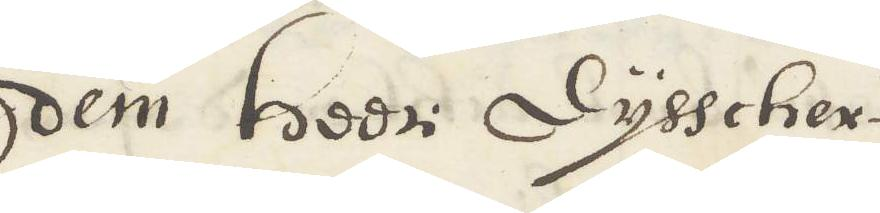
dem heer Eijsscher
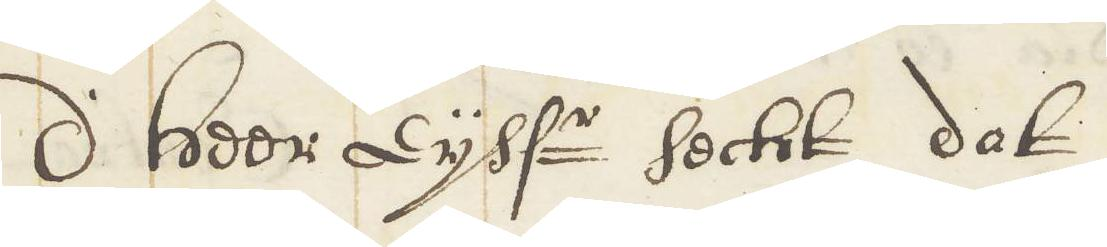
d’ heer Eijss=r secht dat
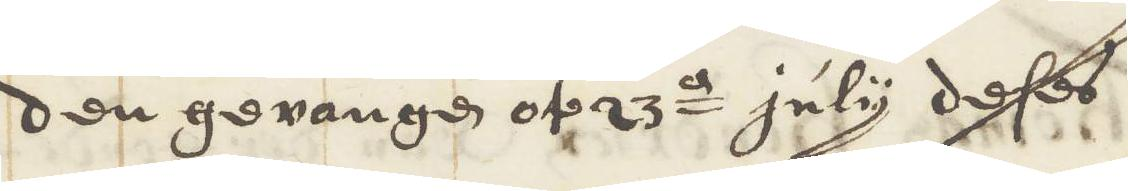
den gevangen op 23=e julij deses
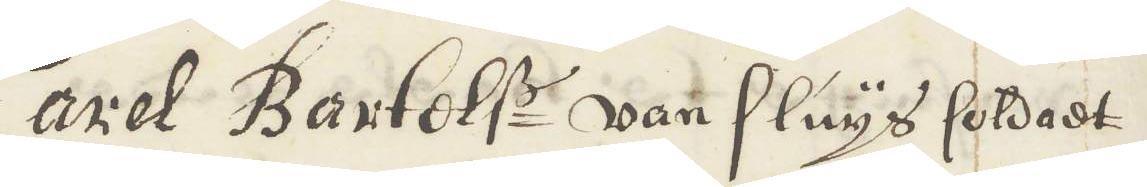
arel Bartolsz van sluijs soldaet
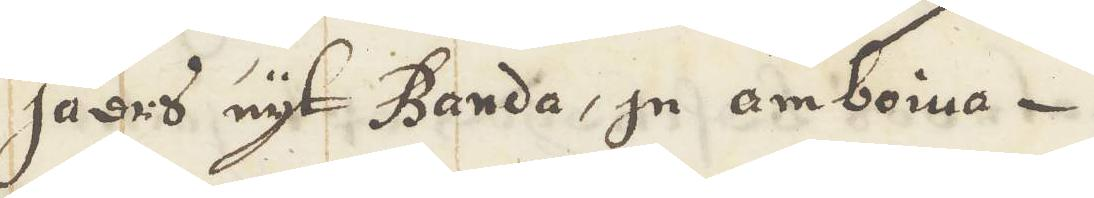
Jaers uijt Banda, jn amboina —
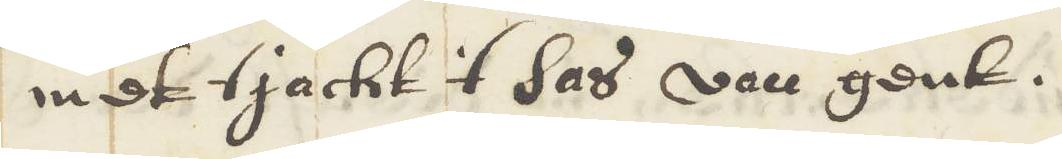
met tjacht ’t sas van gent.
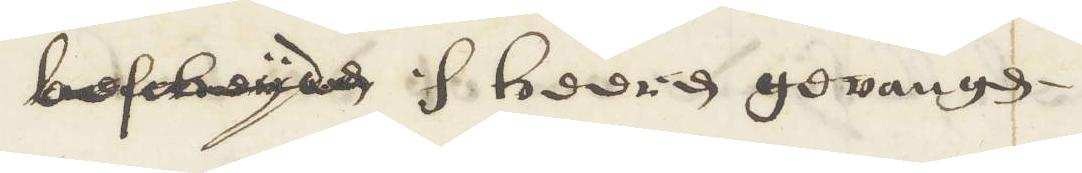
bescheijden 's heeren gevangen
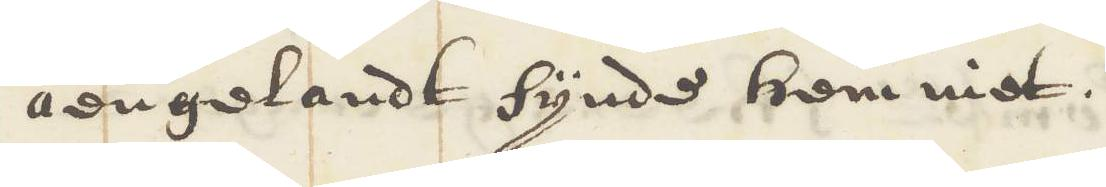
aengelandt sijnde hem niet.
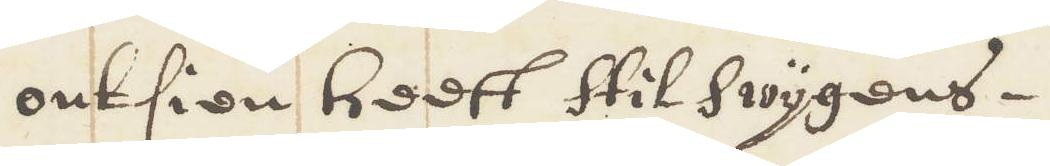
ontsien heeft stil swijgens —
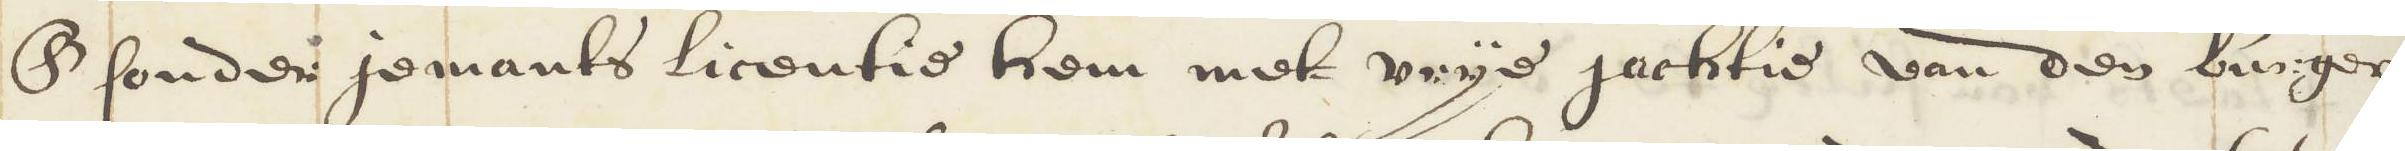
ende sonder jemants licentie hem met vrije jachtie van den burger
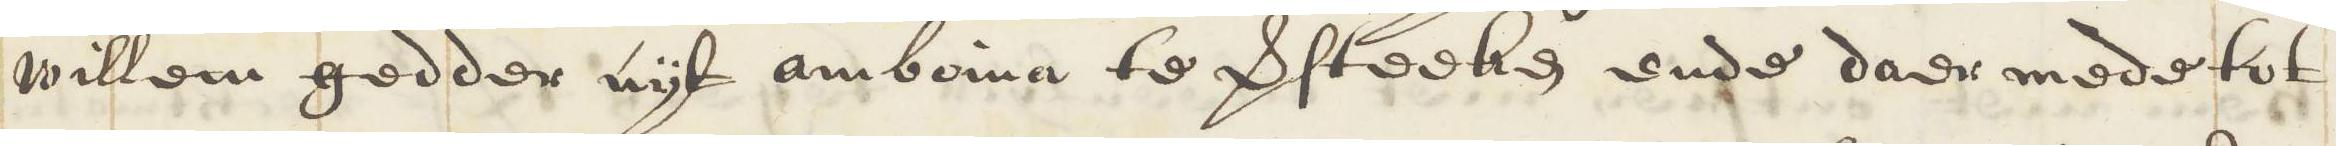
willem gedder uijt amboina te versteeken ende daer mede tot
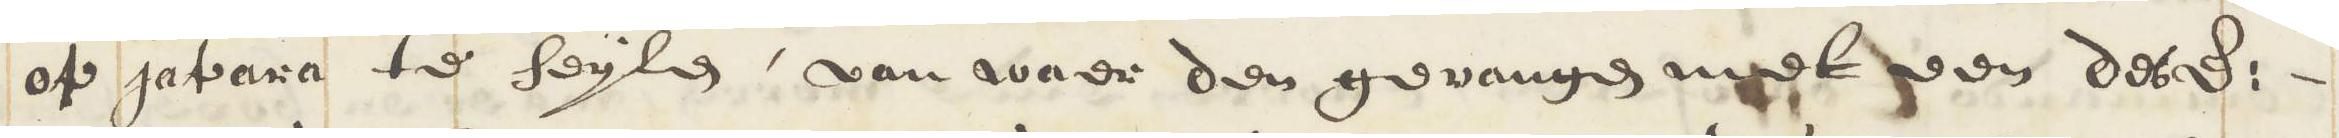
op japara te seijlen, van waer den gevangen met een des E:—
